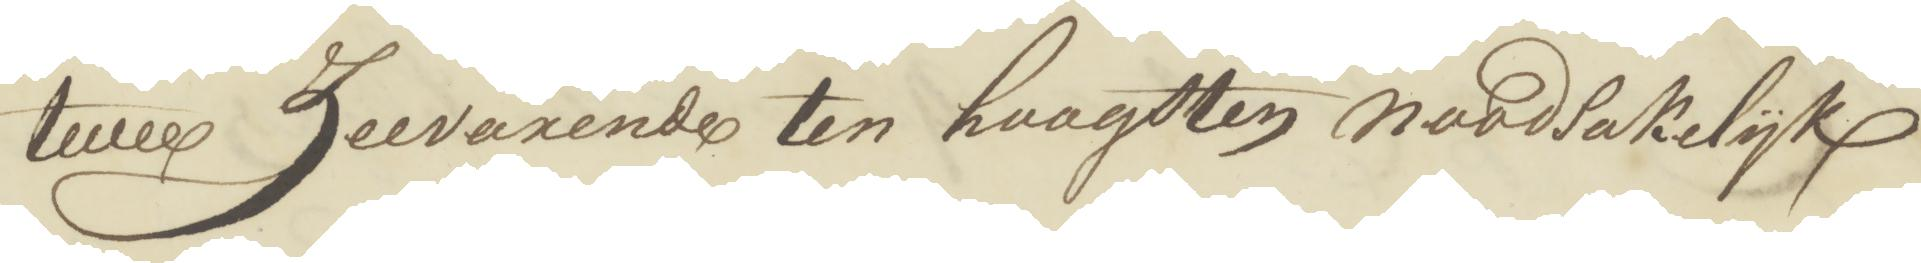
twee Zeevarende ten hoogsten noodsakelijk
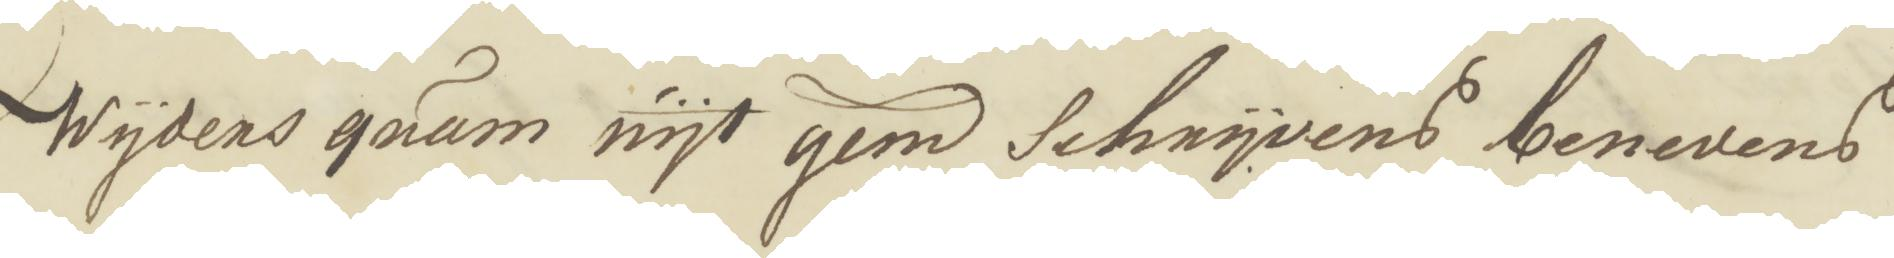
Wijders quam uijt gem schrijvens benevens
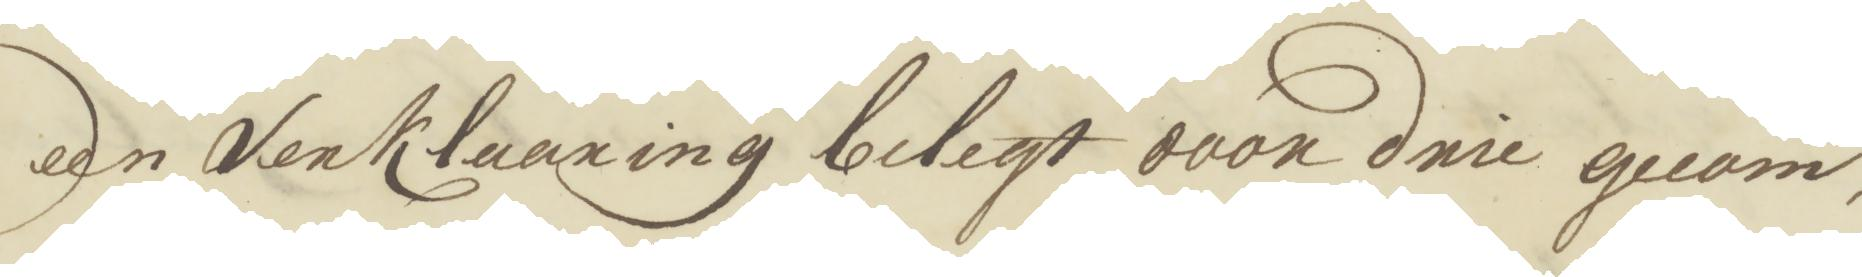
een Verklaaring belegt door drie gecom
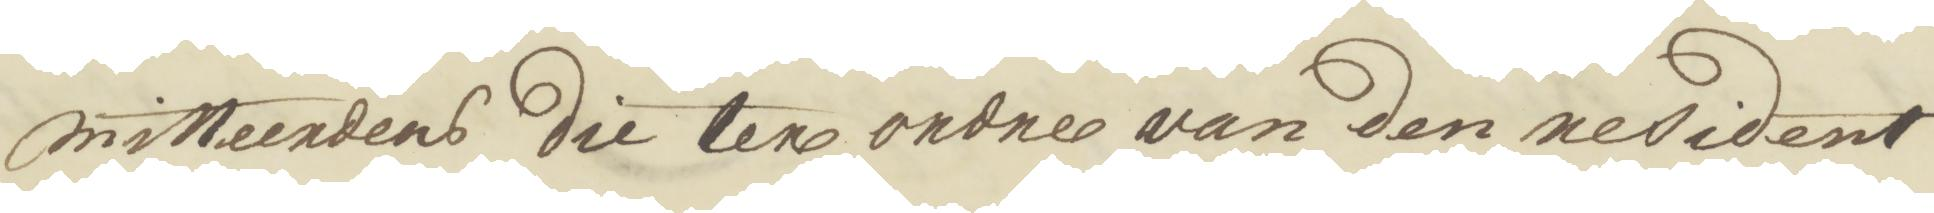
mitteerdens die ter ordre van den resident
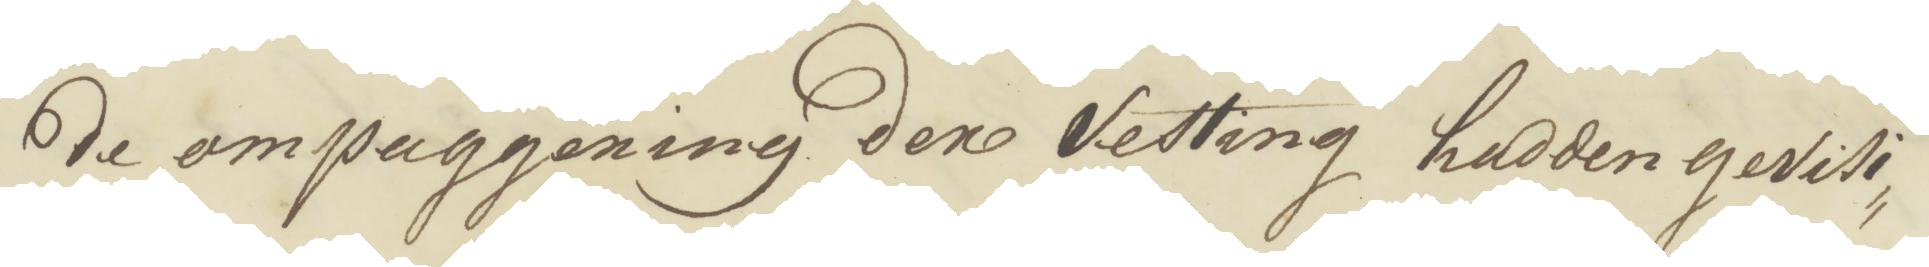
de ompaggering der vesting hadden gevisi„
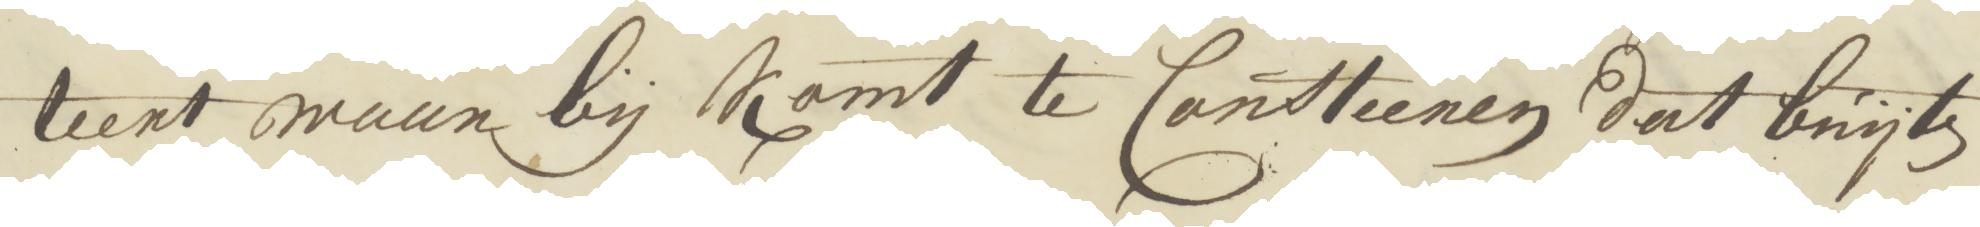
teert waar bij komt te Consteeren dat buijten
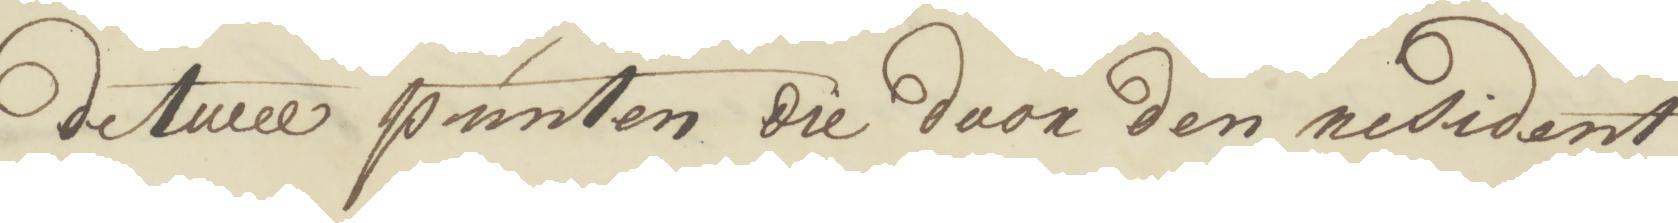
de twee punten die door den resident
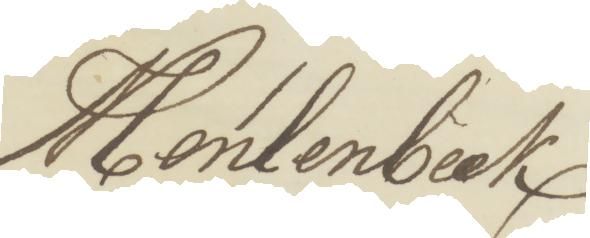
Meulenbeek
